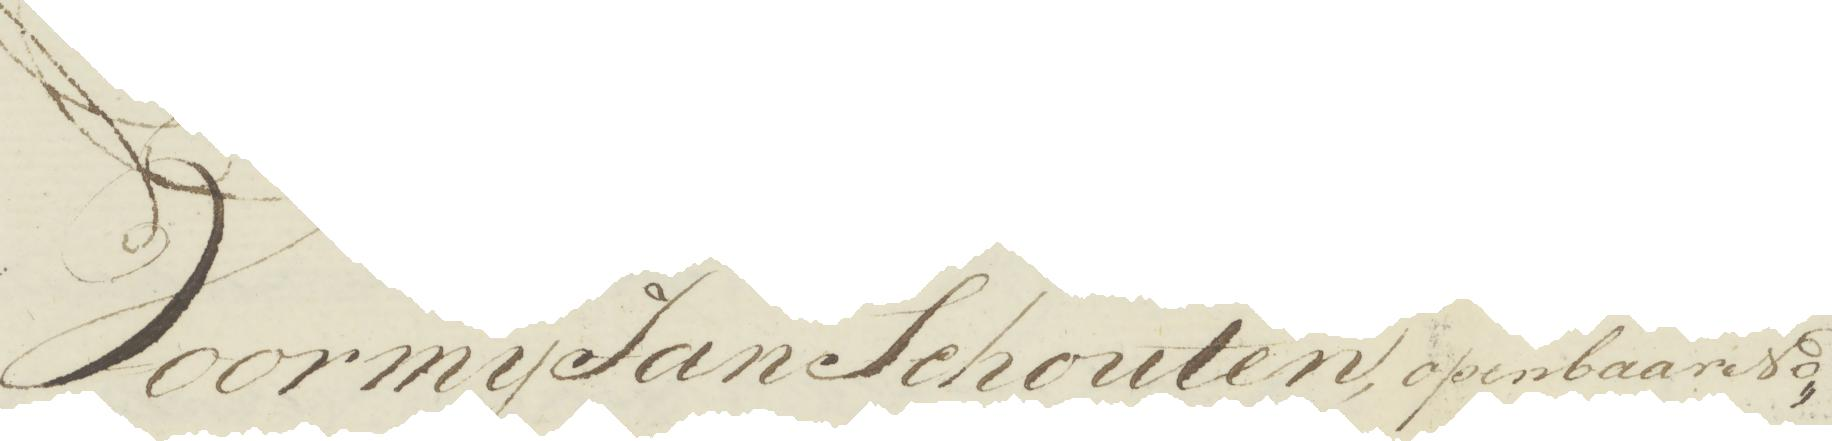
Voor my Ian Schouten, openbaar no„
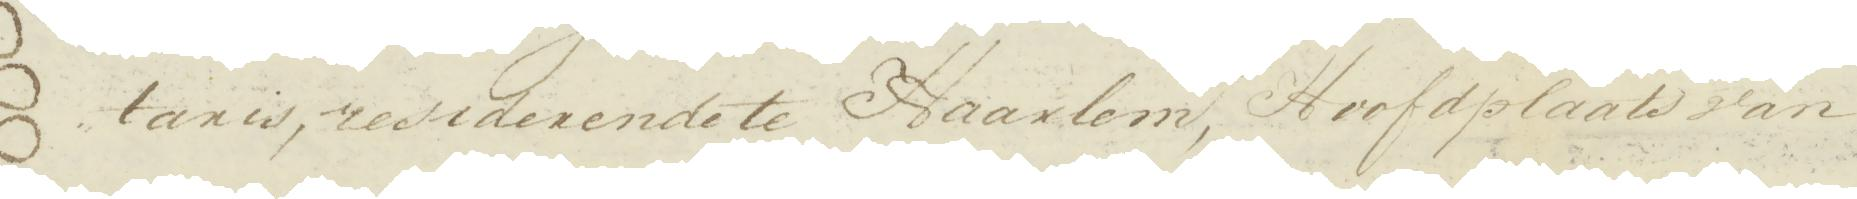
„taris, residerende te Haarlem, Hoofdplaats van
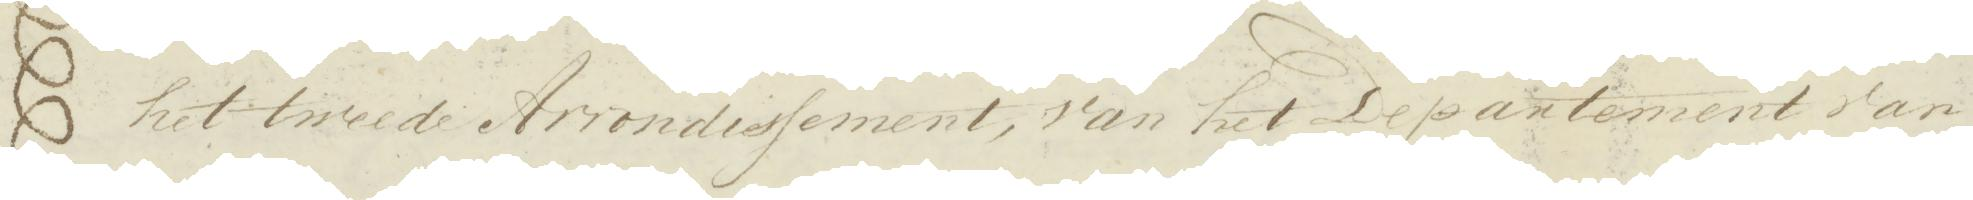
het tweede Arrondissement, van het Departement van
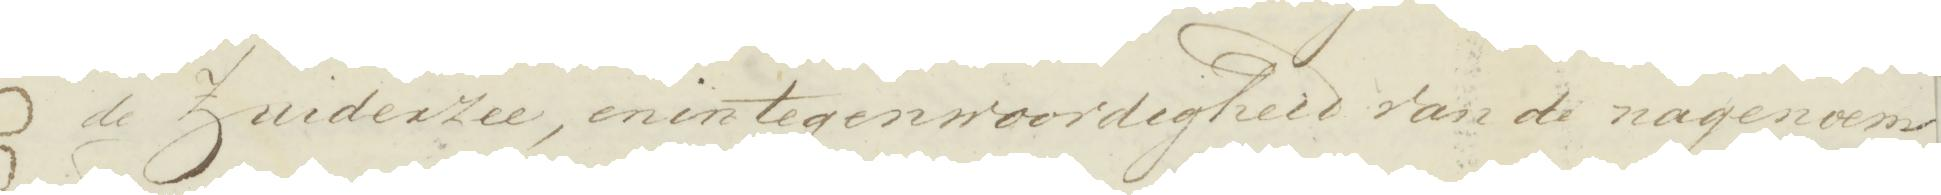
de Zuiderzee, en in tegenwoordigheid van de nagenoem„
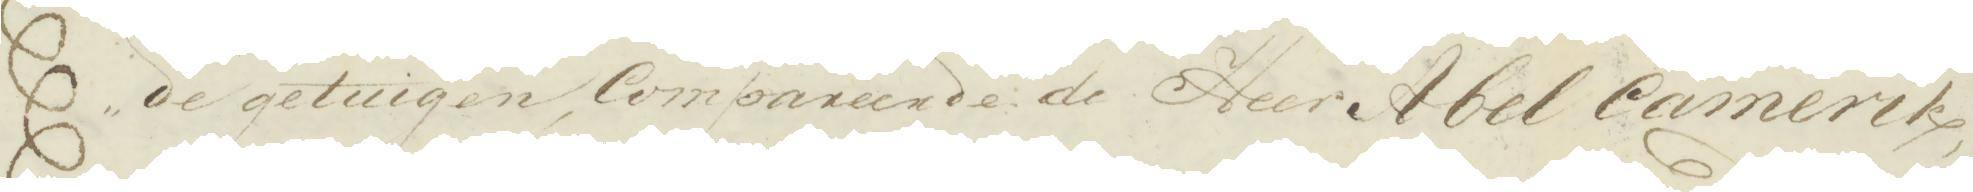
„de getuigen, compareerde de Heer Abel Camerik,
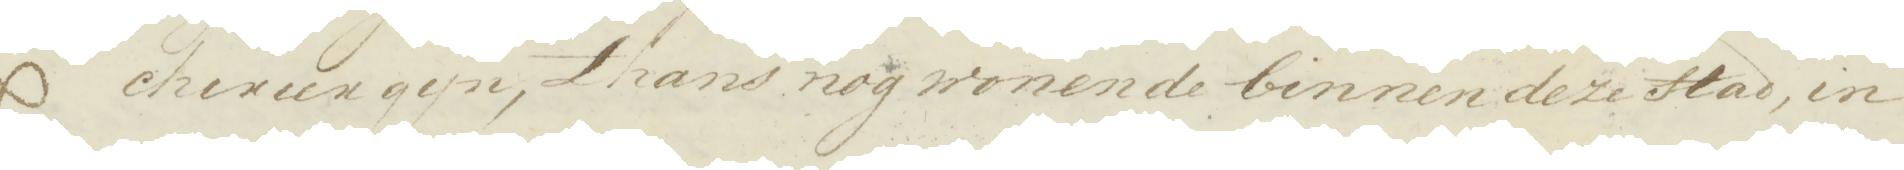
chirurgyn, thans nog wonende binnen deze stad, in
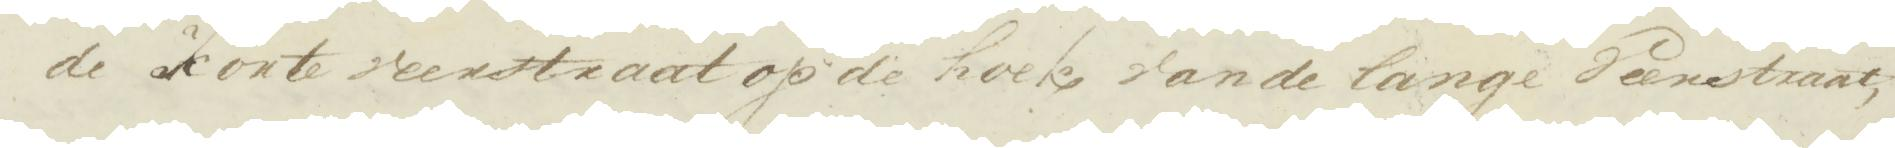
de korte veerstraat op de hoek van de lange Veerstraat,
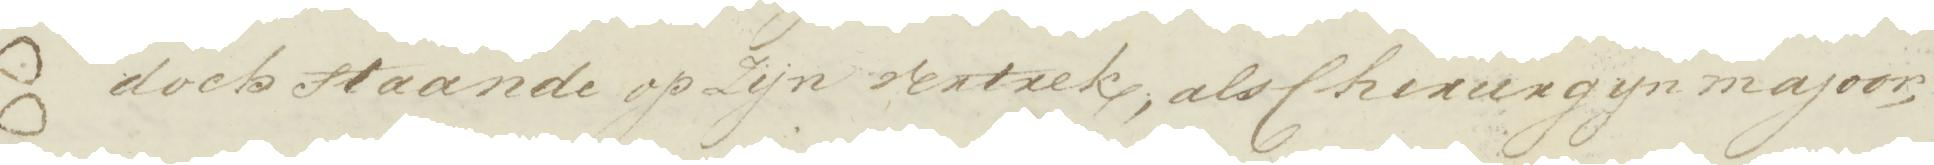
doch staande op zijn vertrek, als Chirurgyn majoor,
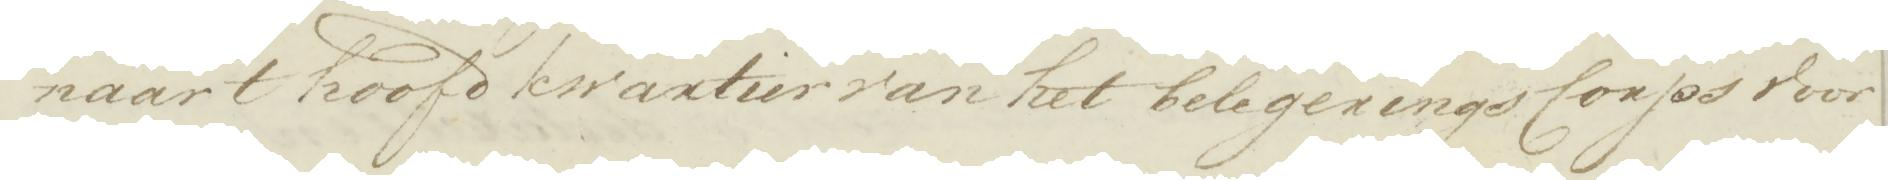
naar ’t hoofd kwartier van het belegerings Corps voor
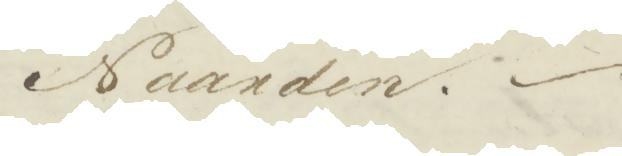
Naarden.
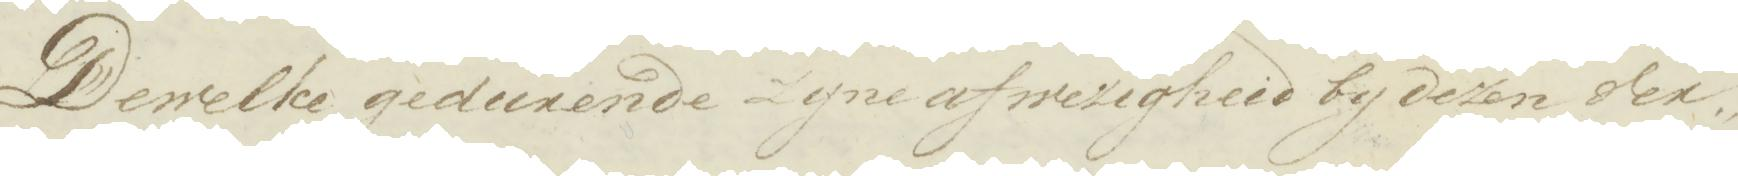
Dewelke gedurende zyne afwezigheid by dezen ver„
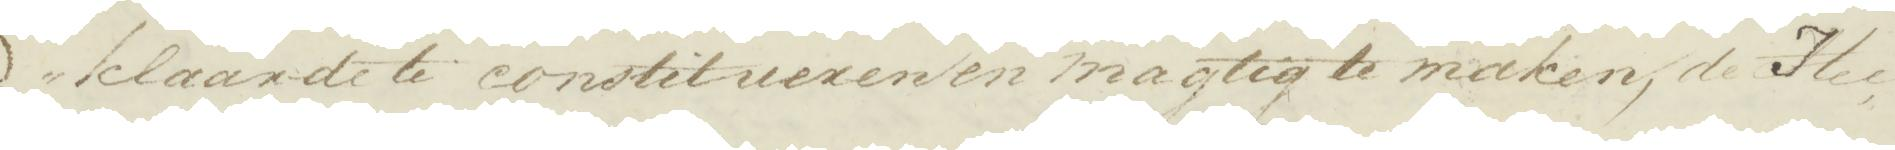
„klaarde te constitueren en magtig te maken, de Hee„
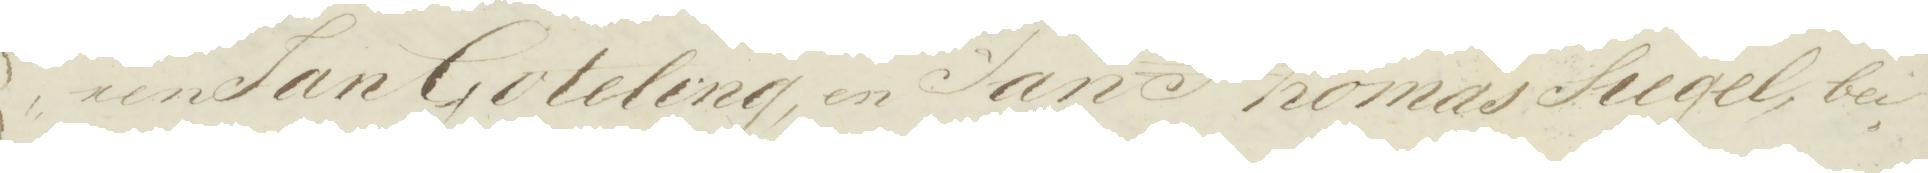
„ren Ian Goteling, en Ian Thomas Siegel, bei
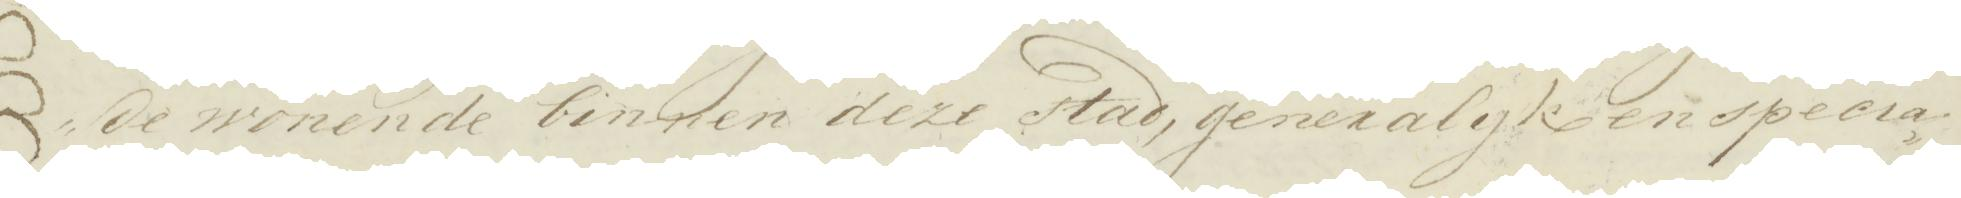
„de wonende binnen deze stad, generalyk en specia„
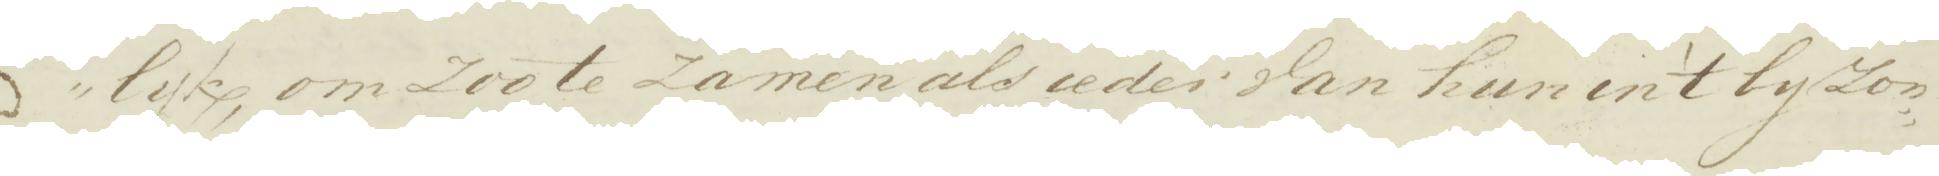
„lyk, om zoo te zamen als ieder van hun in’t byzon„
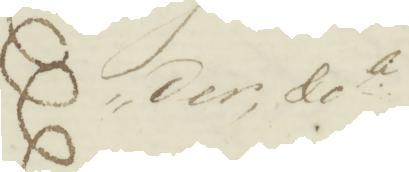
„der, &c.a
